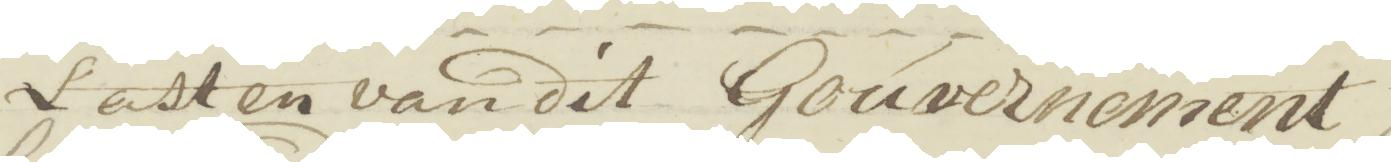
Lasten van dit Gouvernement
